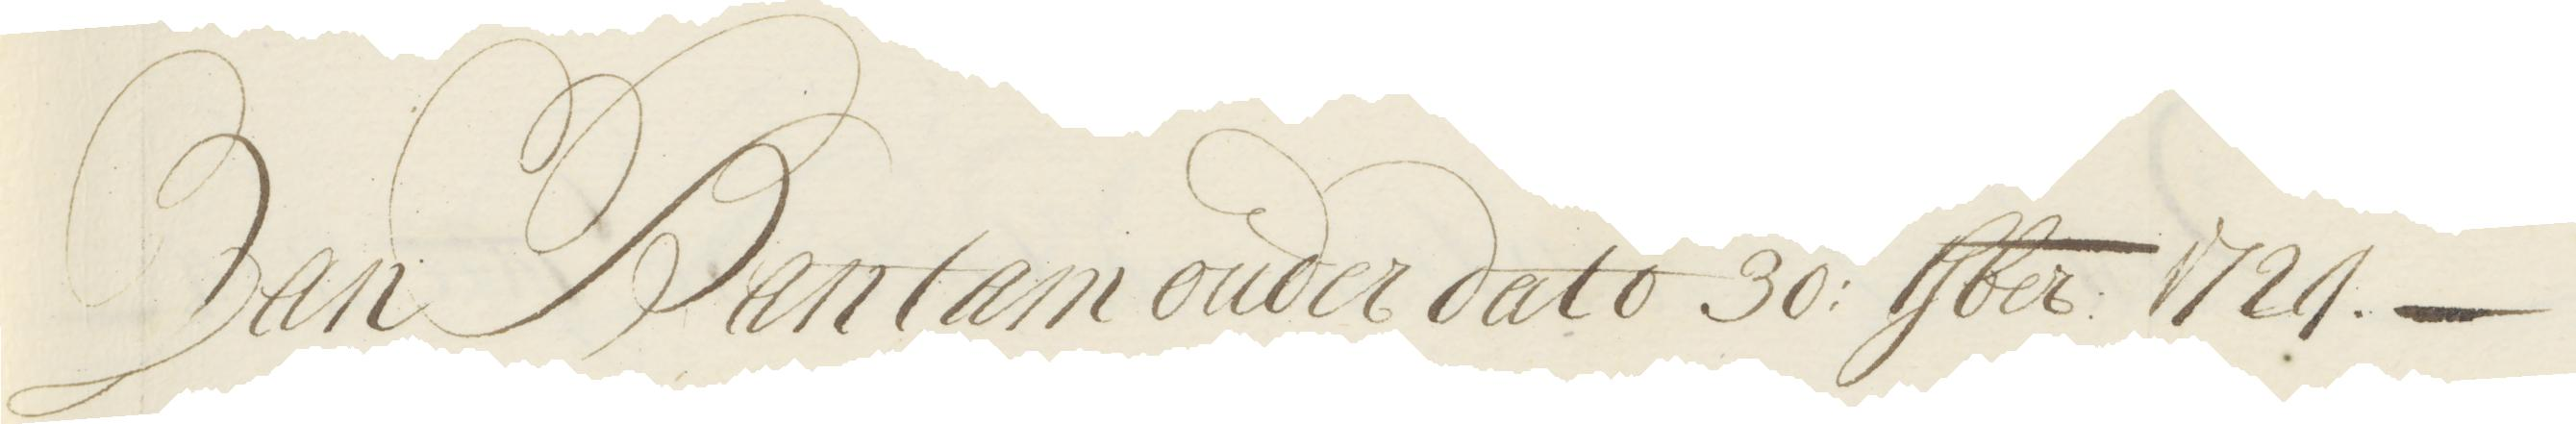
Van Bantam onder dato 30:' 9ber: 1774. —
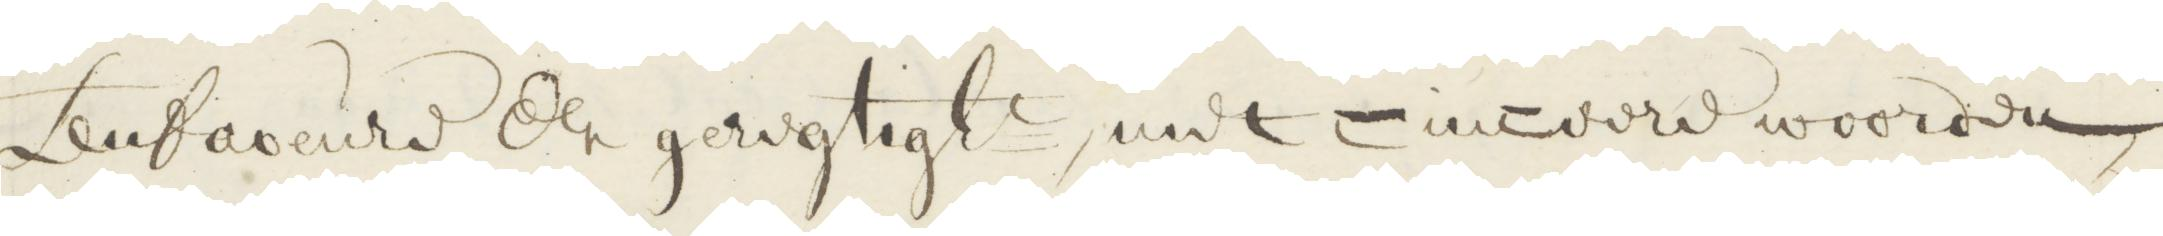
ten faveure der geregtigh=t, met cinceere woorden,
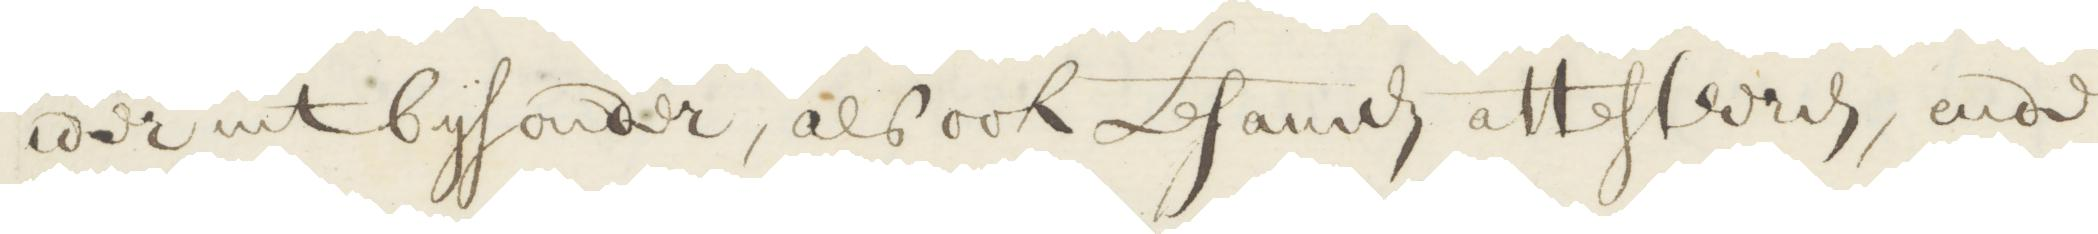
ider in’t bijsonder, als ook tesamen attesteeren, ende
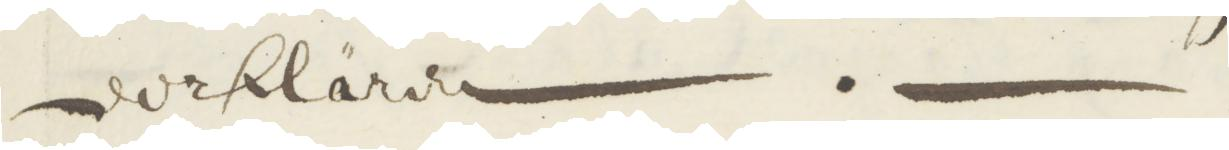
verklären. —
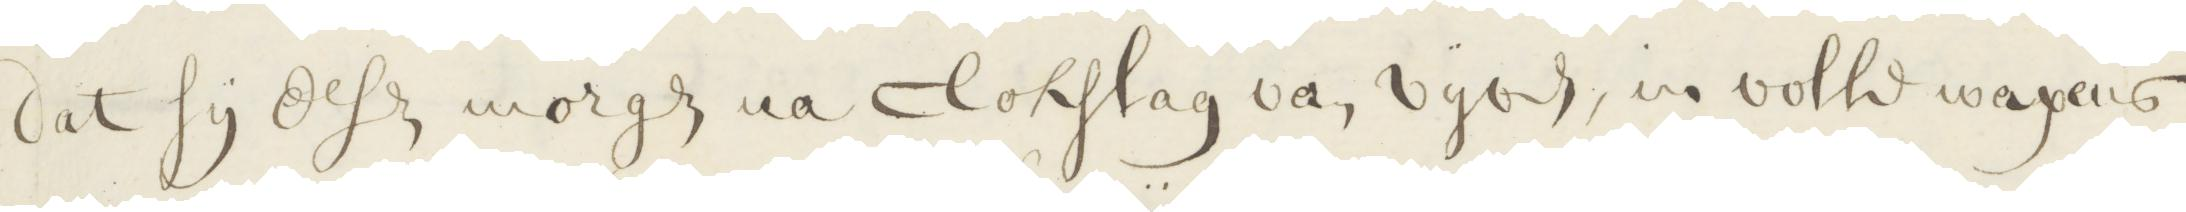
dat sij desen morgen na clokslag van vijven, in volle wapens
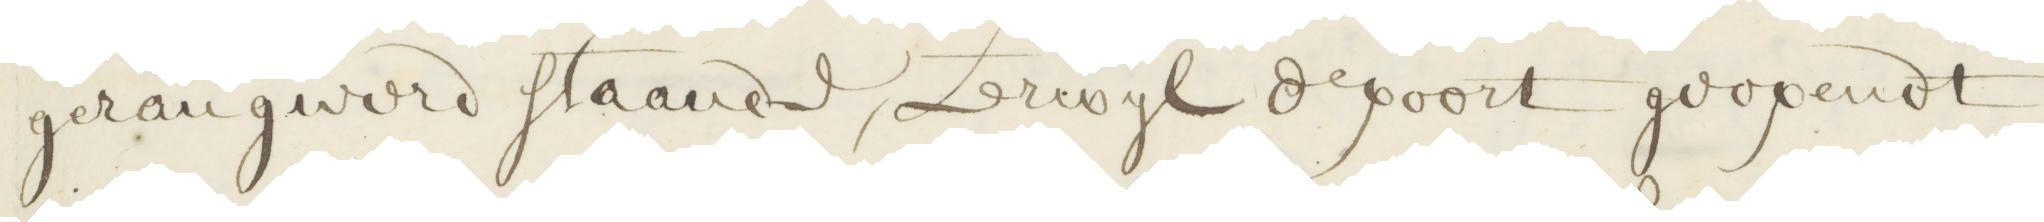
gerangieerd staande, terwijl de poort geopendt
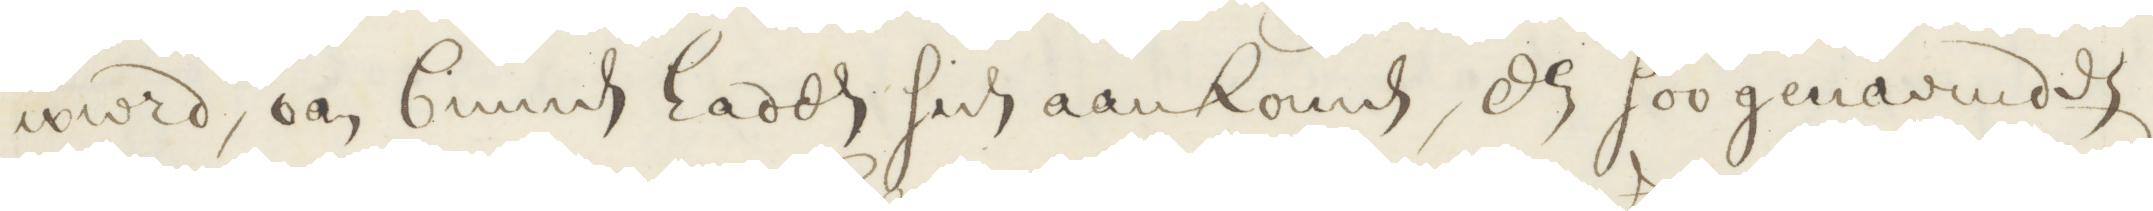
wierd, van binnen hadden sien aankomen, den soo genaemden
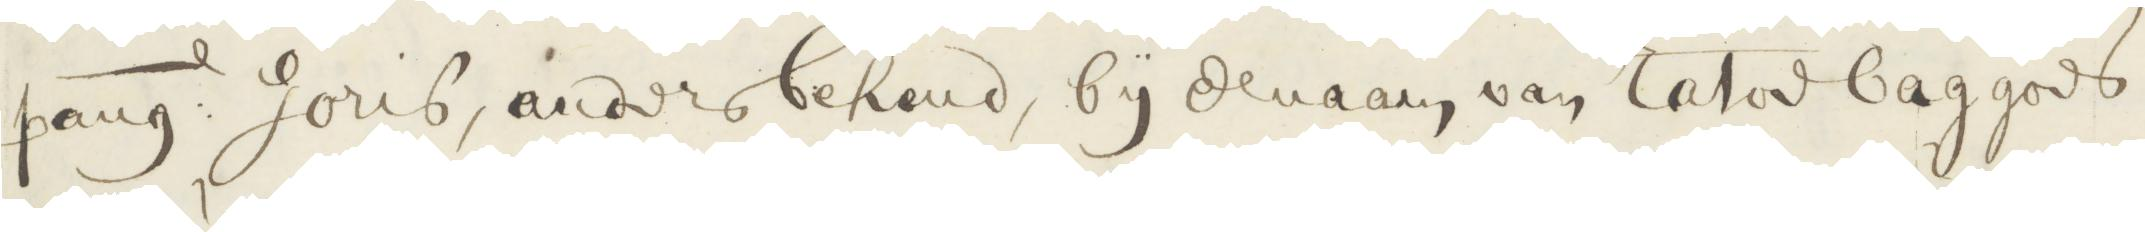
pang:e Joris, andersbekend, bij de naam van ratoe baggoes
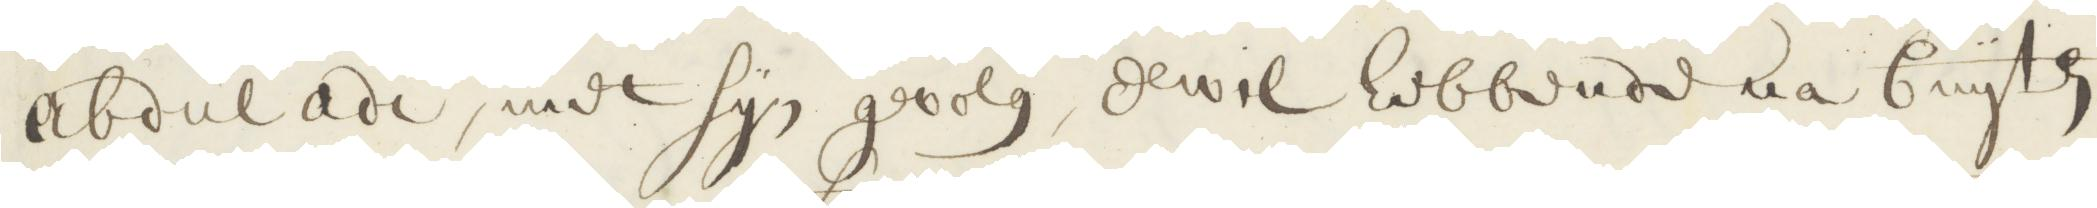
abdul adi, met sijn gevolg, de wil hebbende na buijten
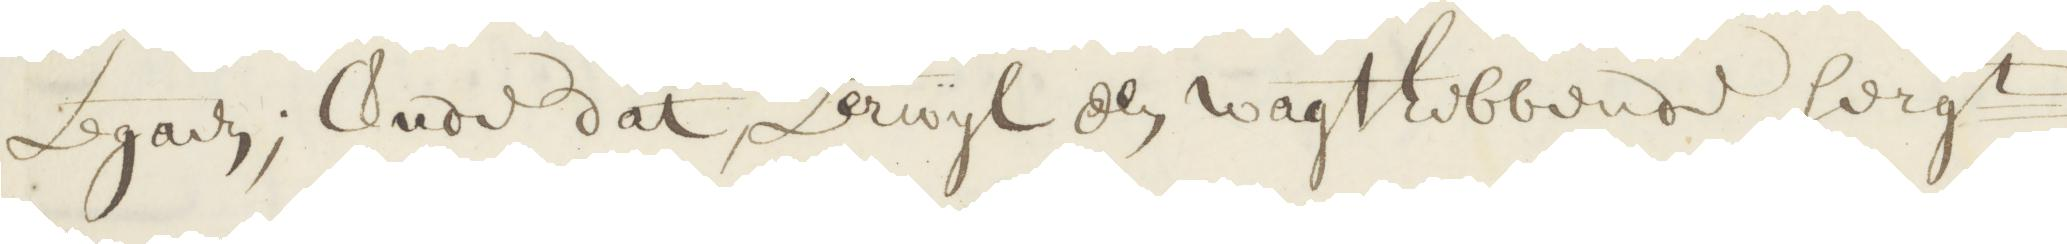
te gaen; Ende dat, terwijl den wagthebbende serg=t
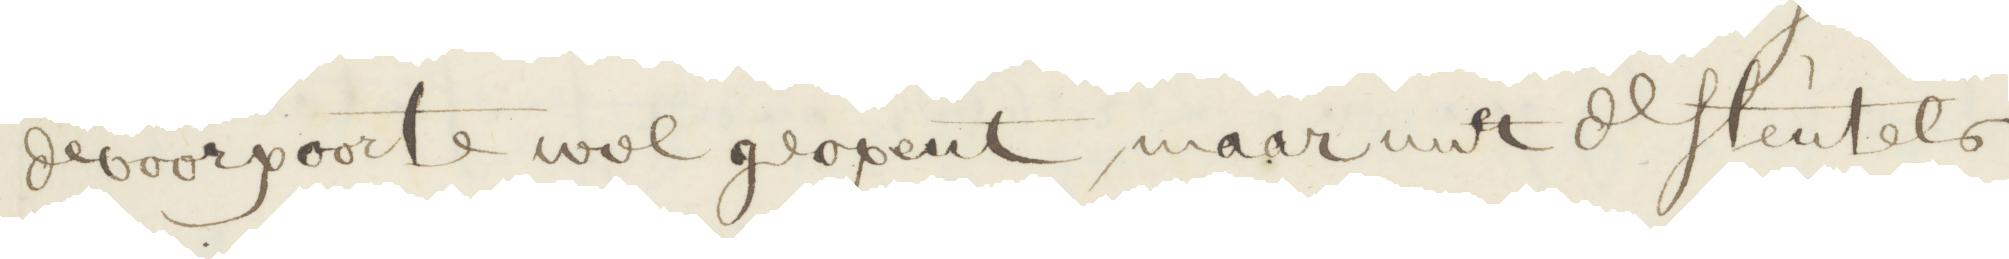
de voorpoorte wel geopent, maar met de sleutels
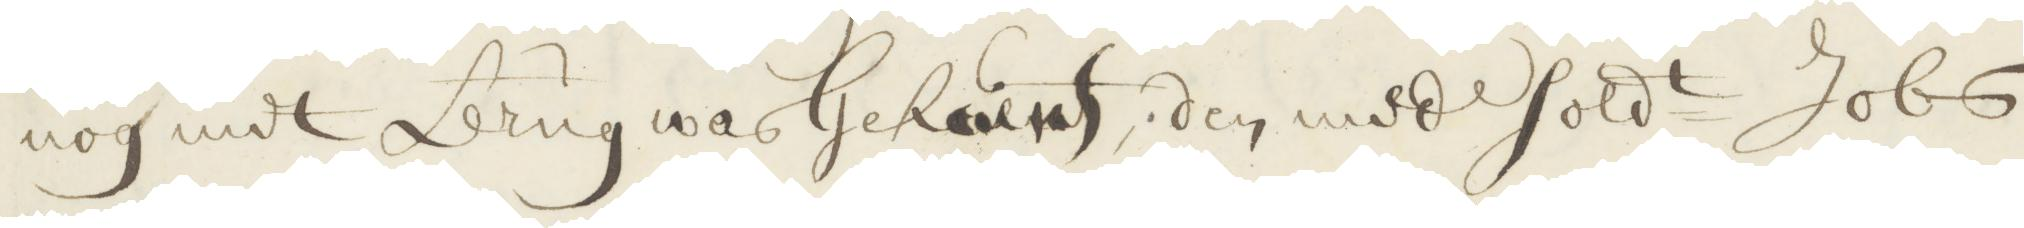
nog niet terug was Gekeert, den mede sold=t Jobs
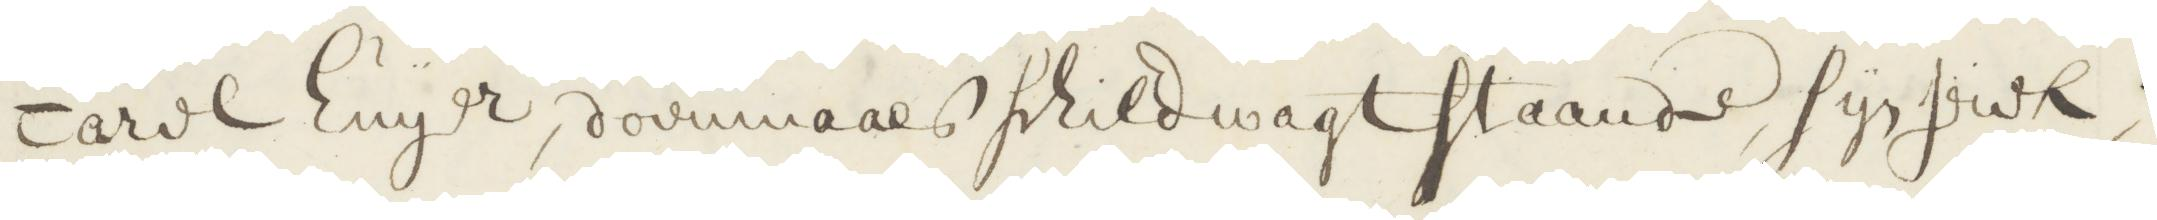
carel huijer, doenmaals schildwagt staande, sijn piek;
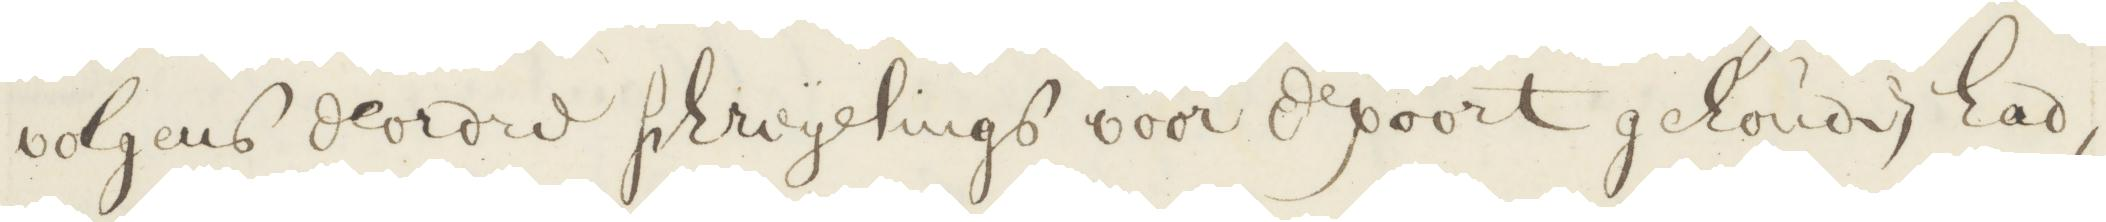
volgens de ordre schreijelings voor de poort gehouden had,
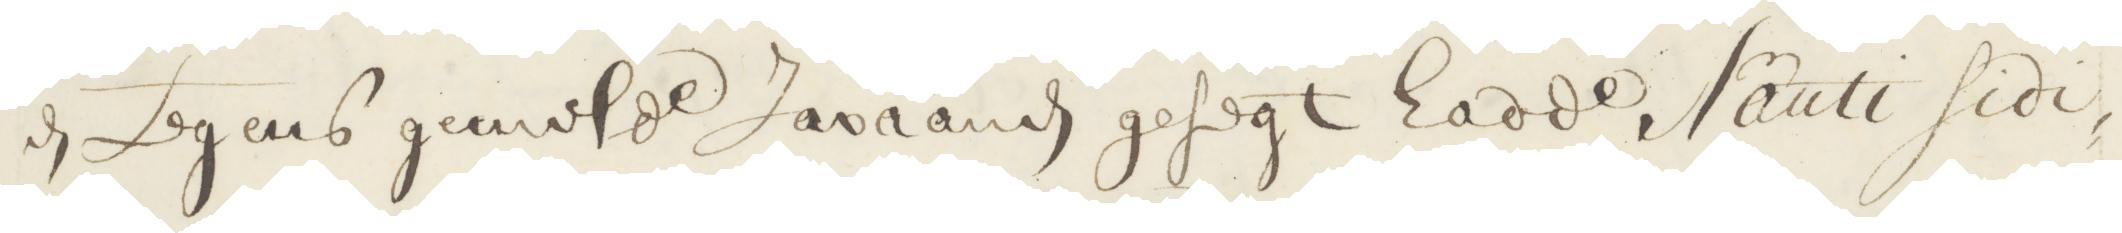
en tegens gemelde Javaanen gesegt hadde Nauti sidi„
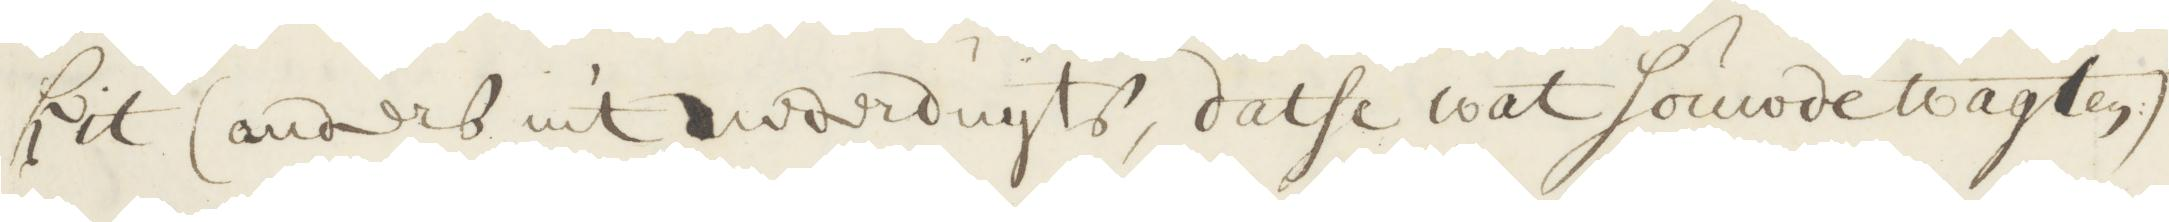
kit (anders in’t nederduijts, datse wat souwde wagten:)
